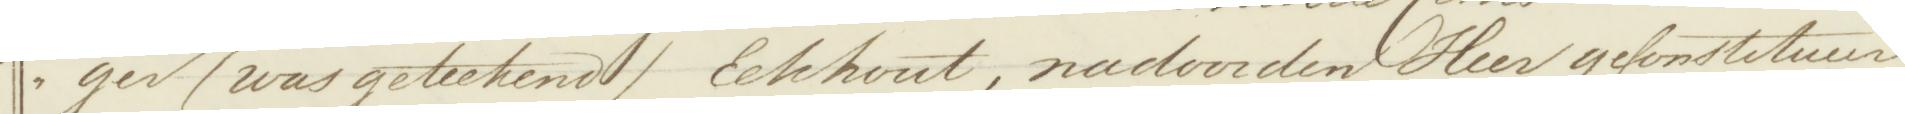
„ger /was geteekend/ Eekhout, nadoor den Heer geconstitueer
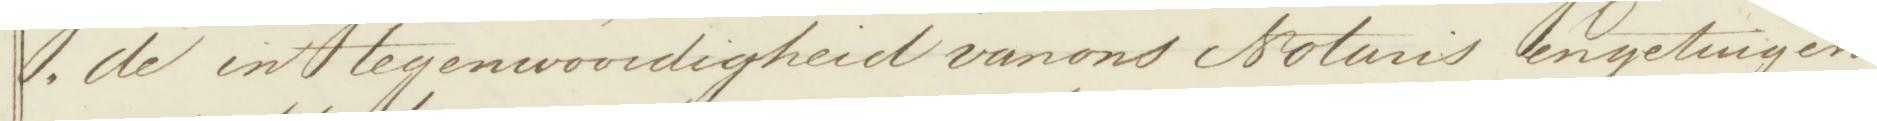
de in tegenwoordigheid van ons Notaris en getuigen
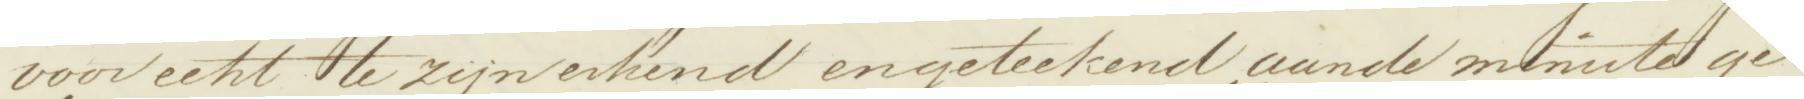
voor echt te zijn erkend engeteekend aande minute ge
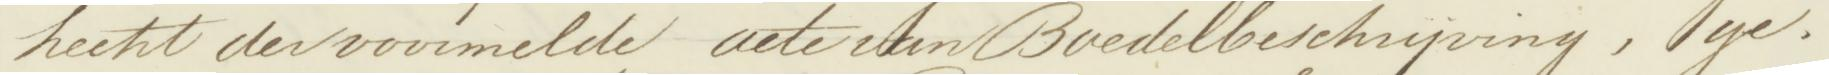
hecht der voormelde acte van Boedelbeschrijving, ge„
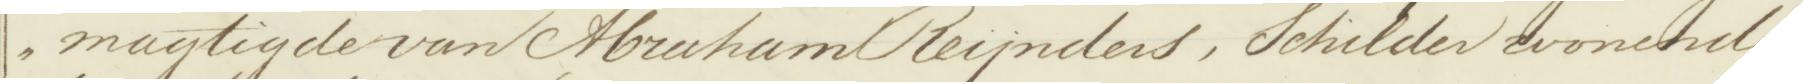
„magtigde van Abraham Reijnders, Schilder wonende
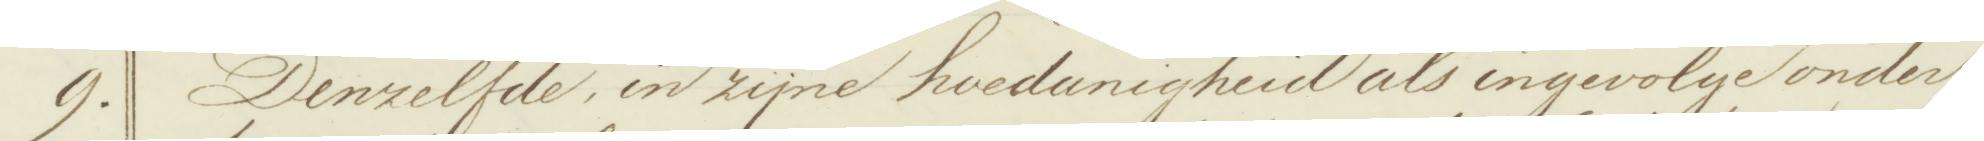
9. Denzelfde, in zijne hoedanigheid als ingevolge onder
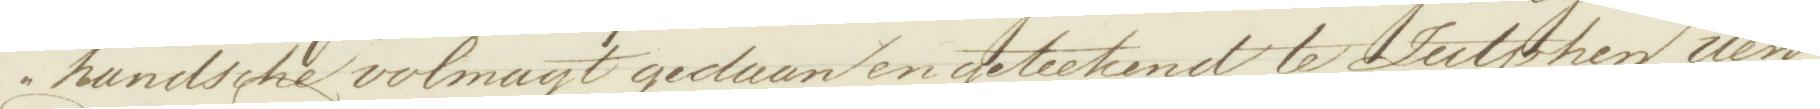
„handsche volmagt gedaan en geteekend te Zutphen den
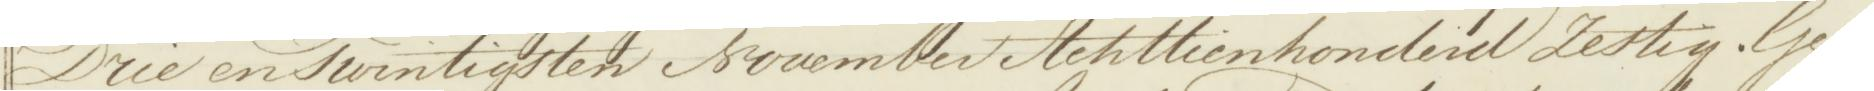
Drie en Twintigsten November Achttienhonderd Zestig. Ge.
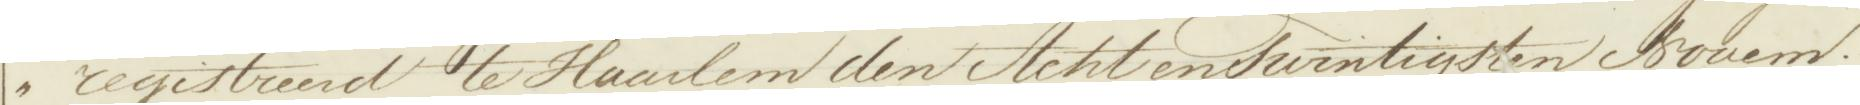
„ registreerd te Haarlem den Acht en Twintigsten Novem.
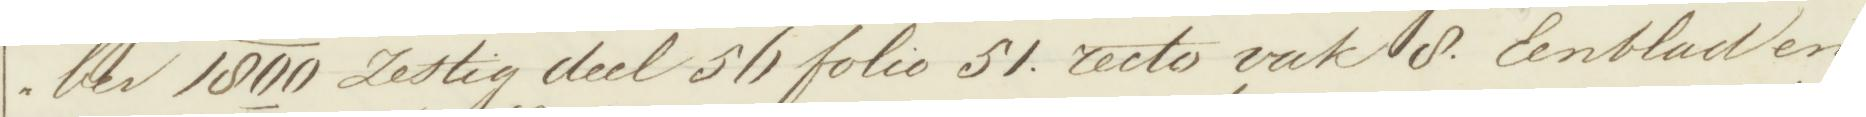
„ber 1800 Zestig deel 56 folio 51. recto vak 8. Eenblad en
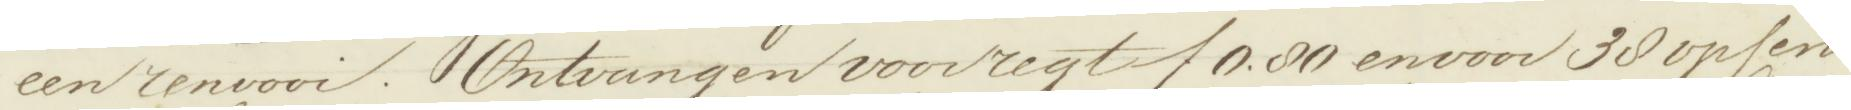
een renvooi. Ontvangen voor regt ƒ0.80 en voor 38 opcen
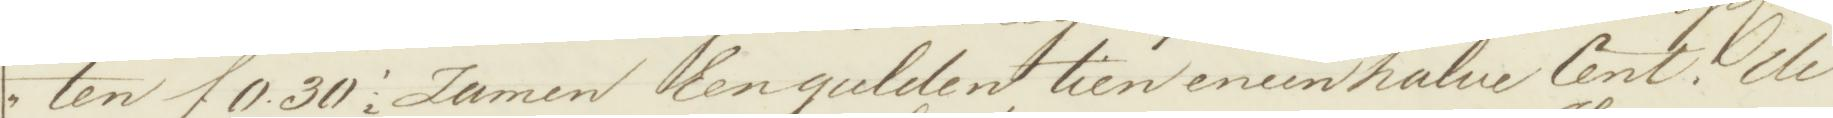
„ten ƒ0.30½ zamen Een gulden tien eneen halve Cent. de
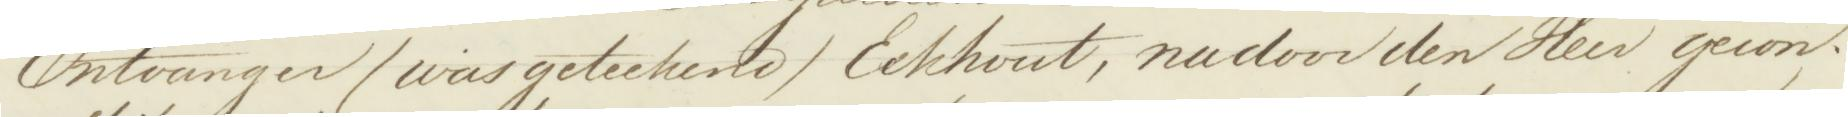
Ontvanger /was geteekend/ Eekhout, nadoor den Heer gecon.
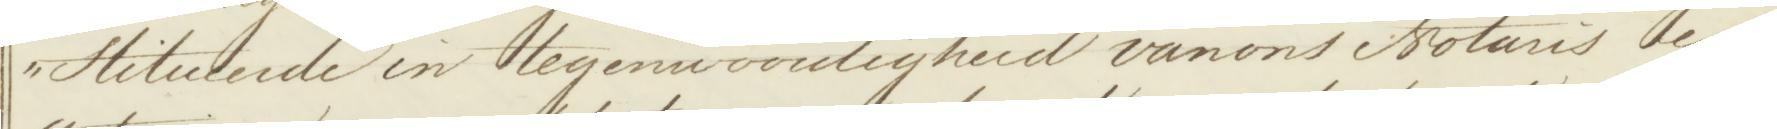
„stitueerde in tegenwoordigheid vanons Notaris en
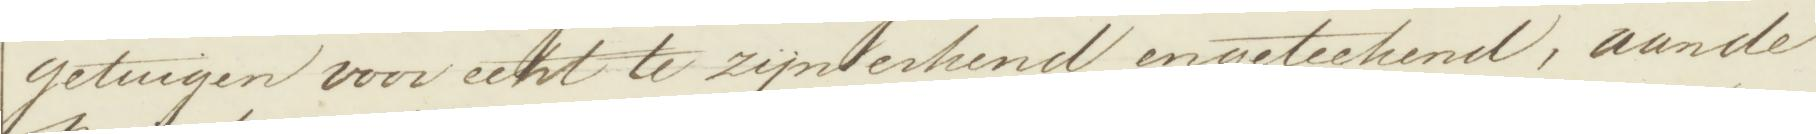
getuigen voor echt te zijn erkend engeteekend, aande
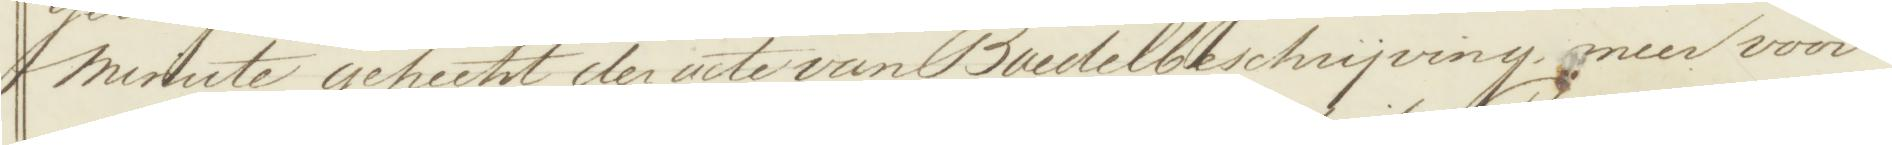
minute gehecht der acte van Boedelbeschrijving, meer voor.
